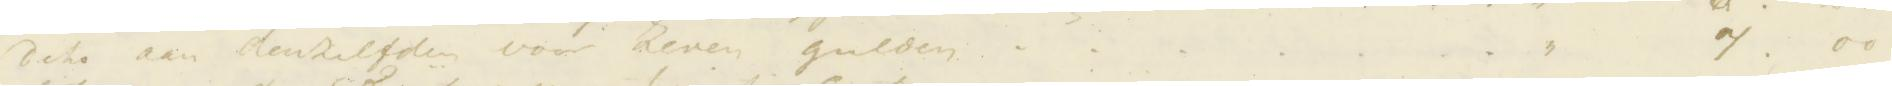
dito aan denzelfden voor zeven gulden „ 7.00
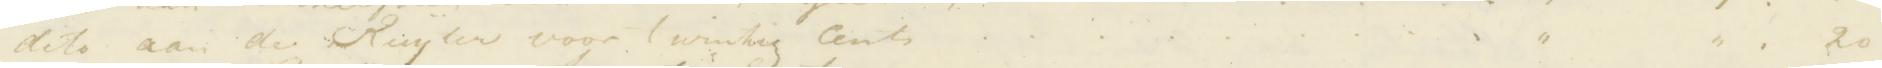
dito aan de Ruijter voor twintig Cents „ „ 20
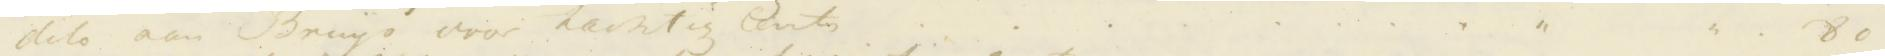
dito aan Bruijs voor tachtig Cents „ „ 80
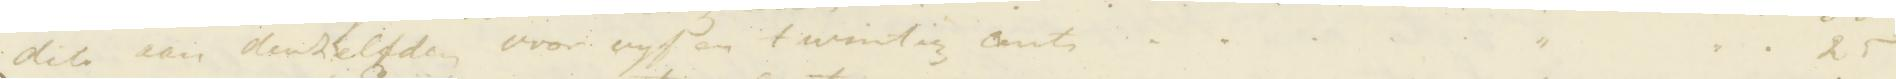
dito aan den Kelfden voor vijf en twintig Cents „ „ 25
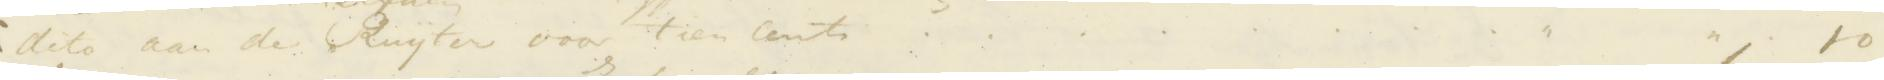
dito aan de Ruijter voor tien Cents „ „ 10
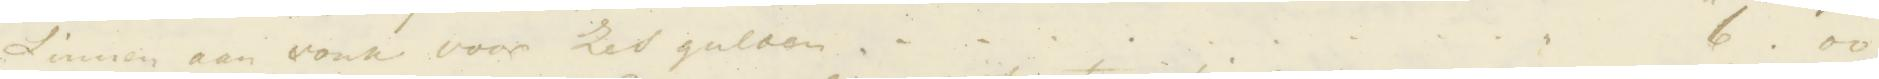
Zinnen aan verk voor Zes gulden „ 6.00
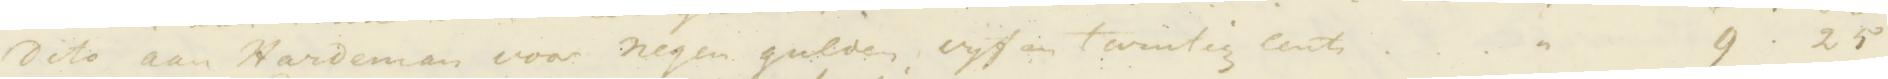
dito aan Hardeman voor negen gulden, vijf en twintig Cents „ 9.25
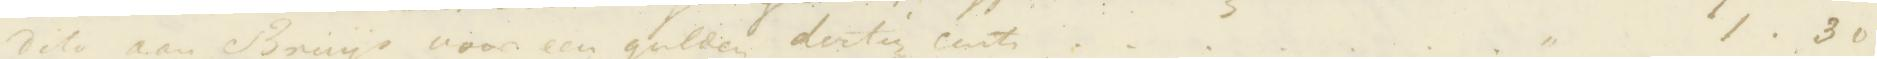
dito aan Bruijs voor een gulden dertig cents „ 1.30
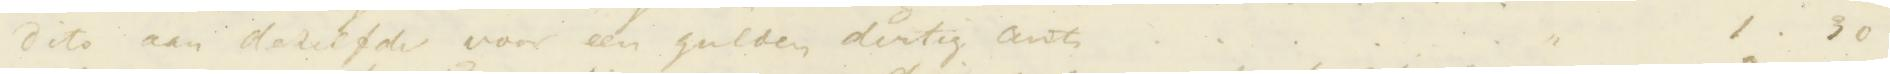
dito aan dezelfde voor een gulden dertig cent „ 1.30
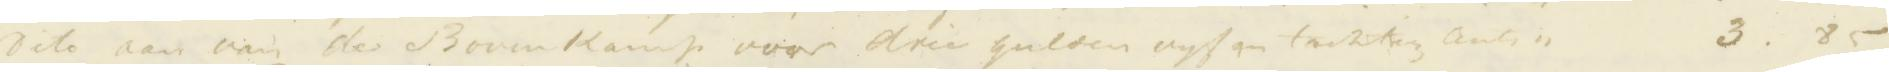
dito aan van der Bovenkamp voor drie gulden vijf en tachtig Cents „ 3.85
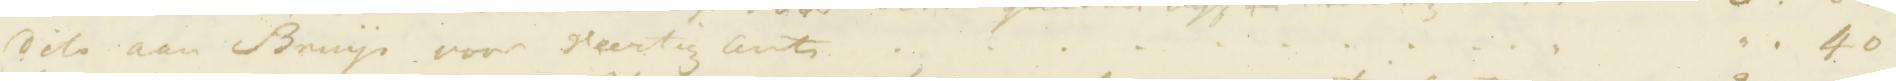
dito aan Bruijs voor Veertig Cents. „ „ 40
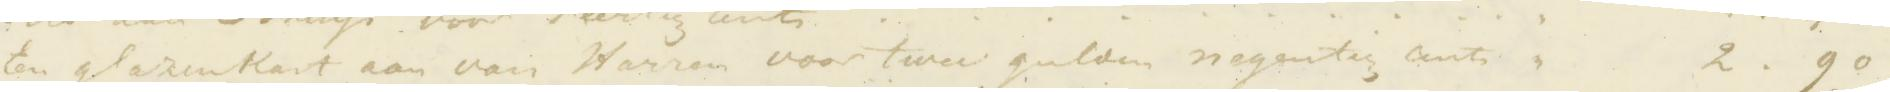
Een glazenkast aan van Harren voor twee gulden negentig Cents „ 2.90
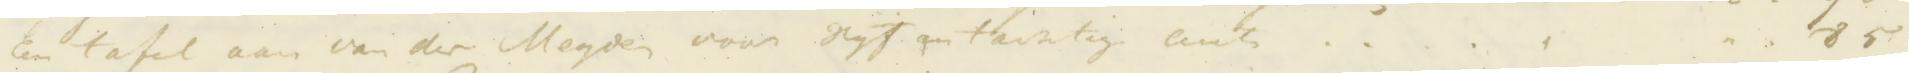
Een tafel aan van der Megden voor Vijf en tachtig Cents „ „ 85
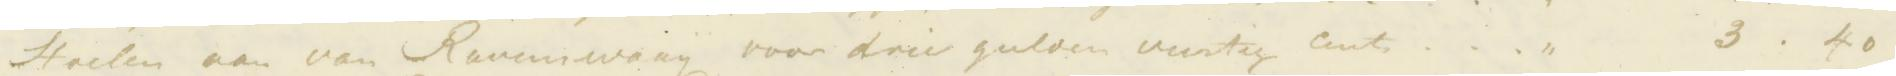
Hoelen aan van Ravenswaag voor drie gulden veertig Cents „ 3.40
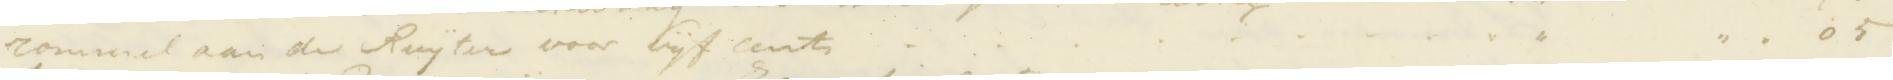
rommel aan de Ruijter voor vijf Cents „ „ 05
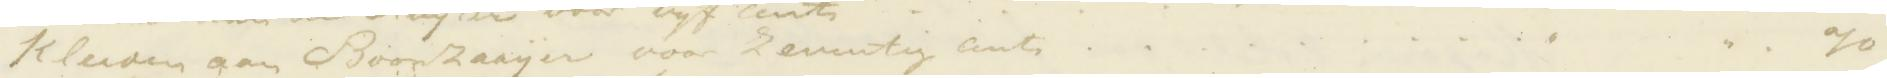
Kleiden aan Boopzaaijer voor Zeventig cents „ „ 70
